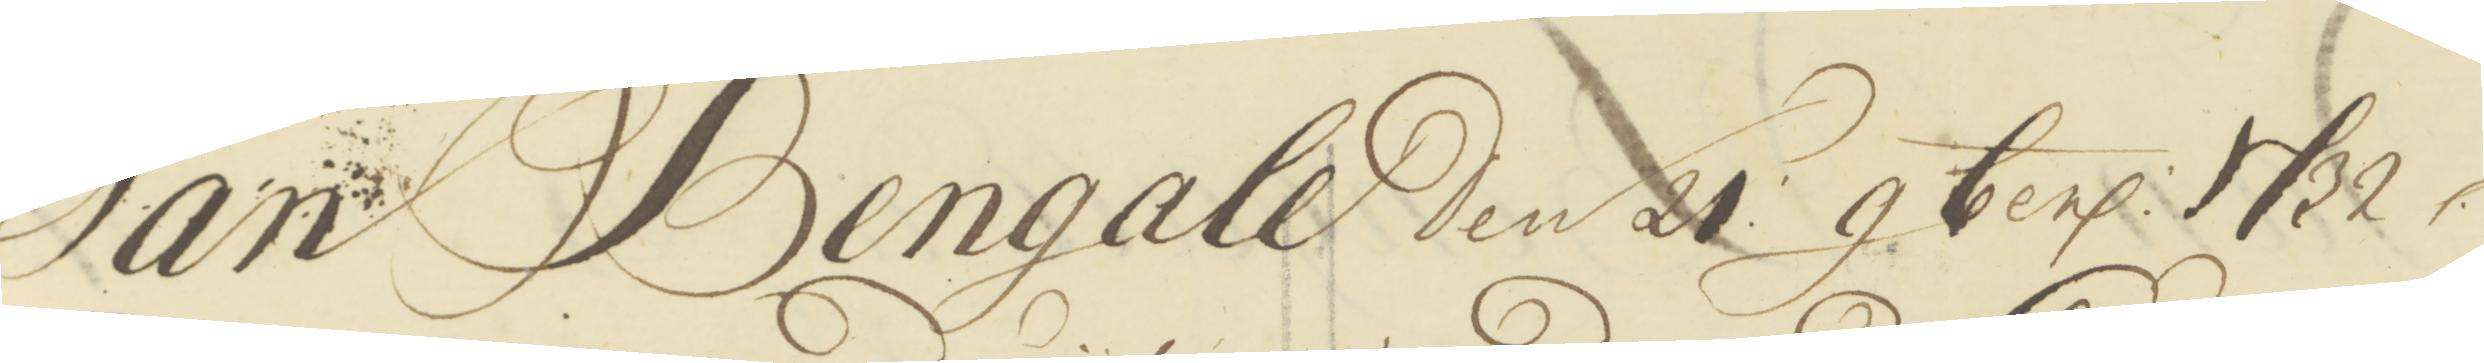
Van Bengale den 21: 9ber: 1732.
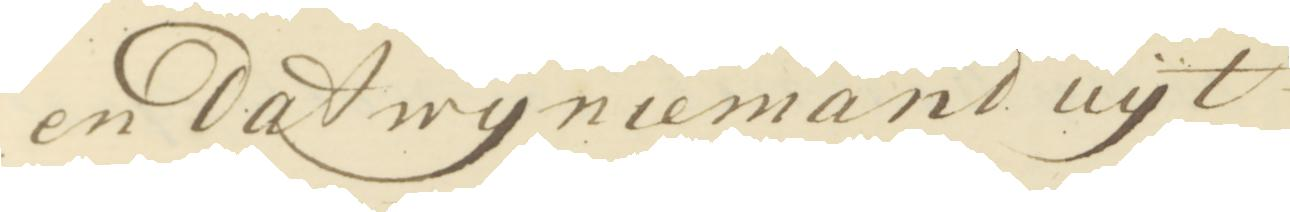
en dat wij niemand uijt
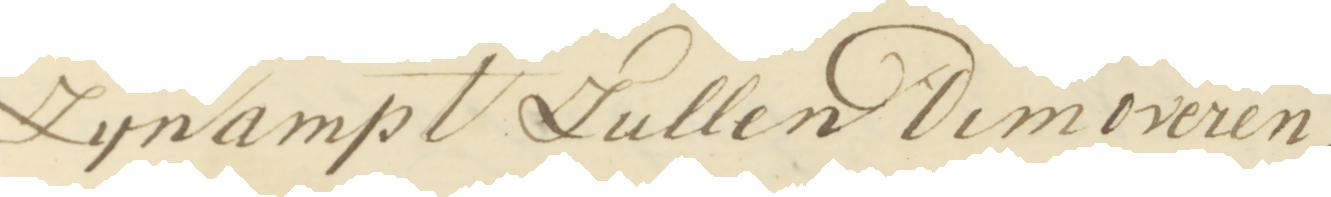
Zijn ampt Zullen dimoveren
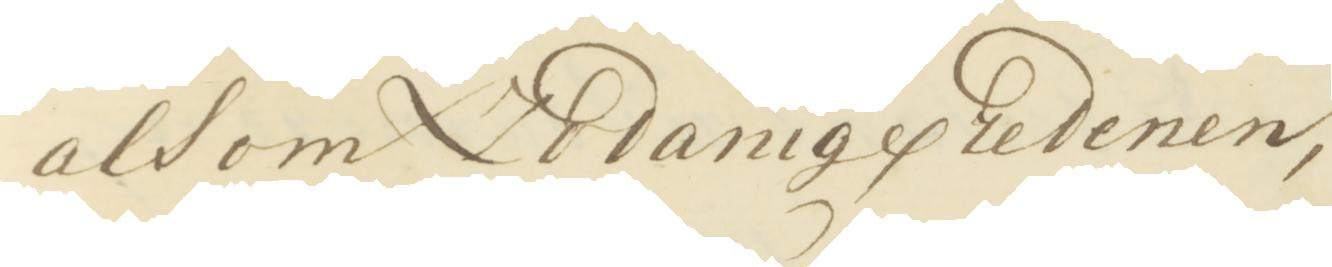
als om Zodanige redenen,
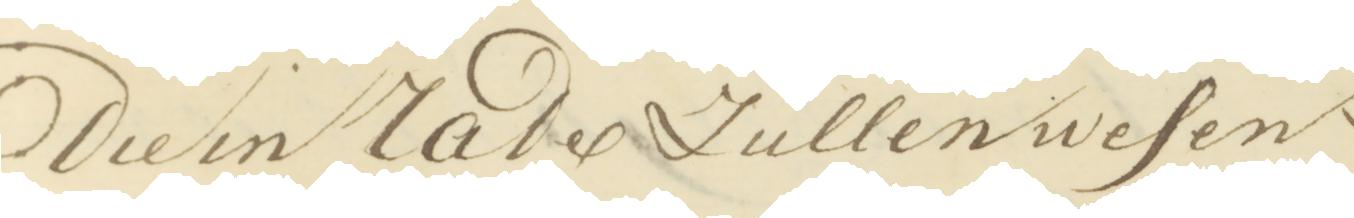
die in Rade zullen wesen
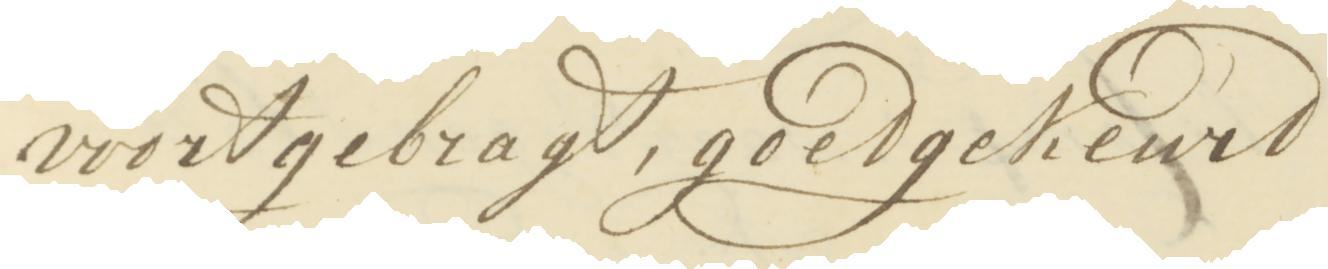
voortgebragt, goedgekeurd
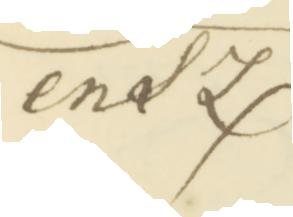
ensz
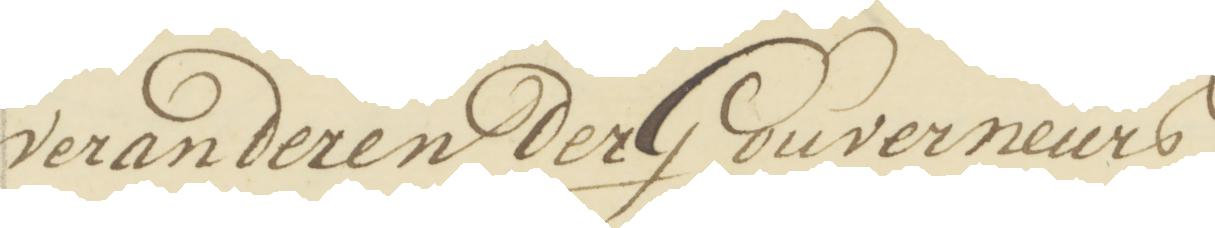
veranderen der Gouverneurs,
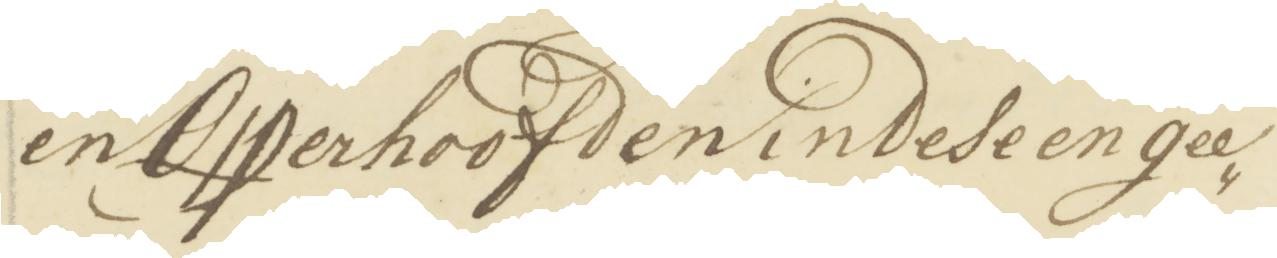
en Opperhoofden in dese en gee„
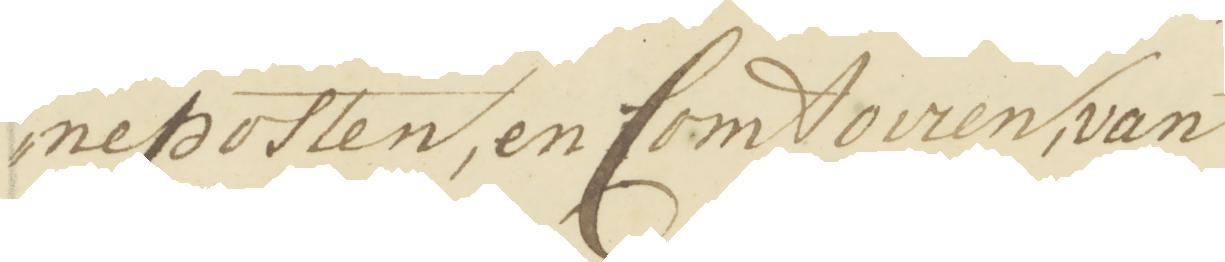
ne posten, en Comtoiren, van
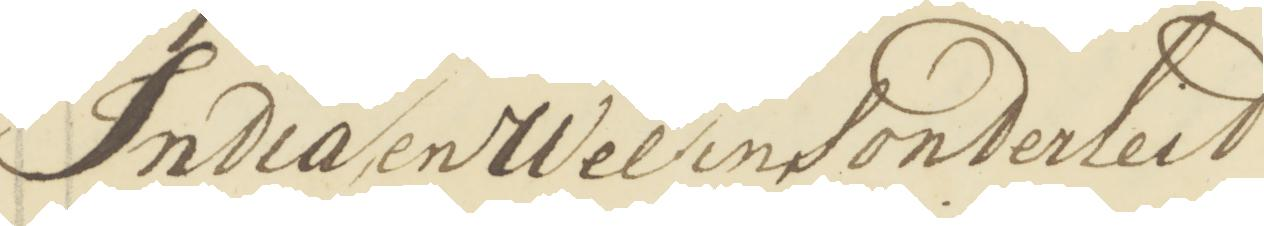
India en Wel insonderleid
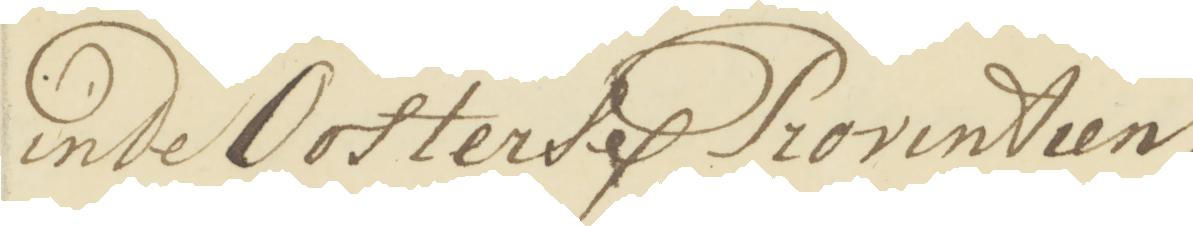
in de Oosterse Provintien,
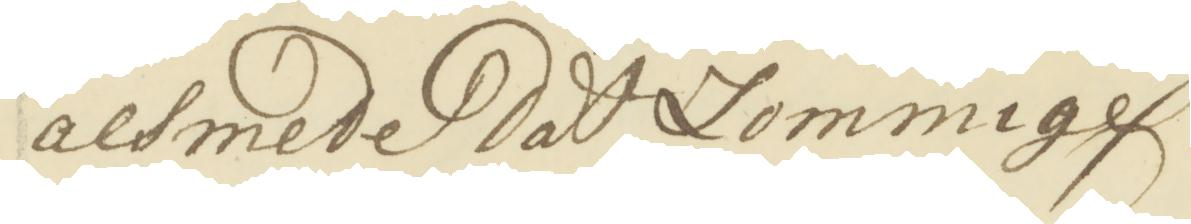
als mede dat Zommige
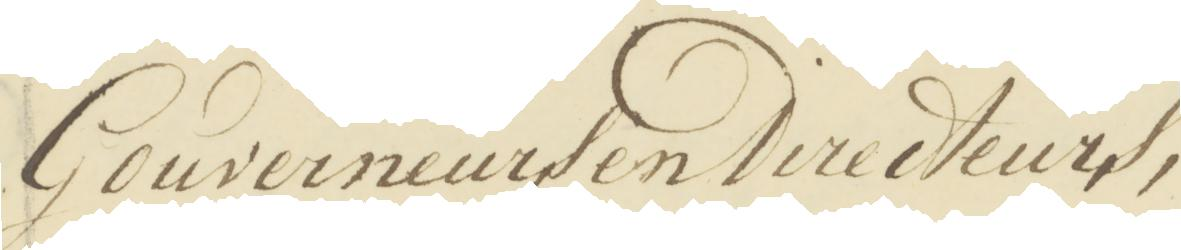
Gouverneurs en Directeurs,
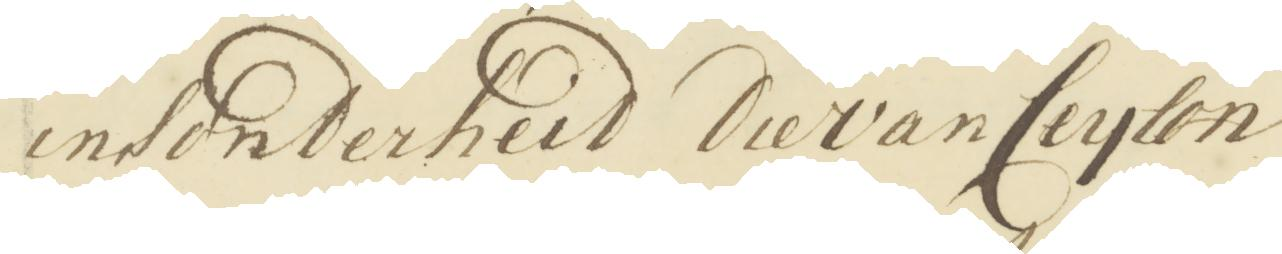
insonderheid die van Ceylon
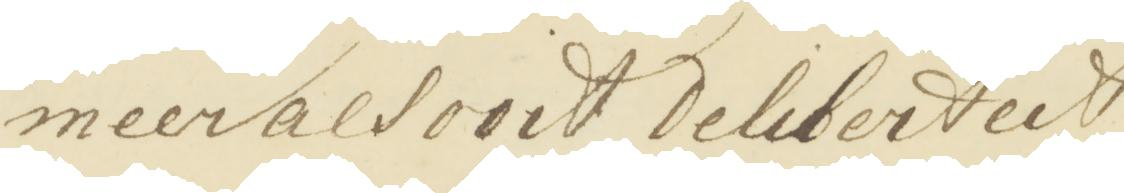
meer als ooit de liberteit
